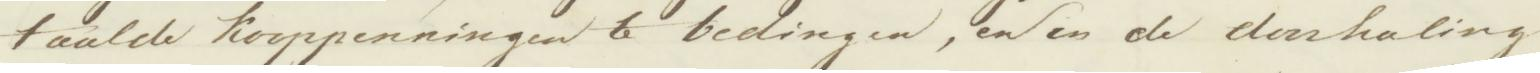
taalde kooppenningen te bedingen, en in de doorhaling
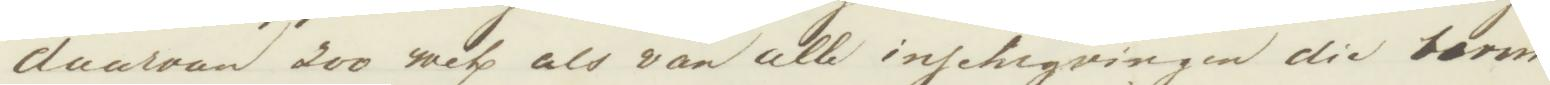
daarvan zoo wel als van alle inschryvingen die bevon
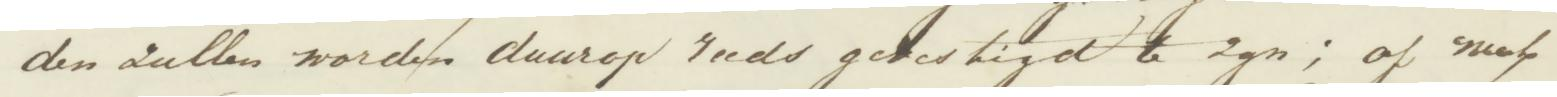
den zullen worden daarop reeds gevestigd te zijn; of wel,
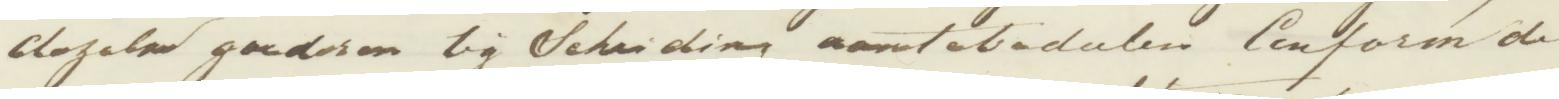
dezelve goederen bij scheiding aante bedeelen Conform de
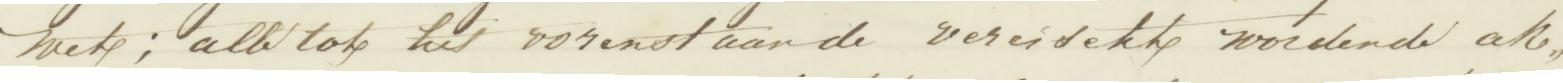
wet; alle tot het vorenstaande vereischt wordende ak
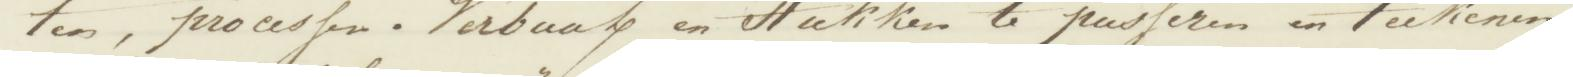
ten, processen - Verbaal en stukken te passeren en teekenen
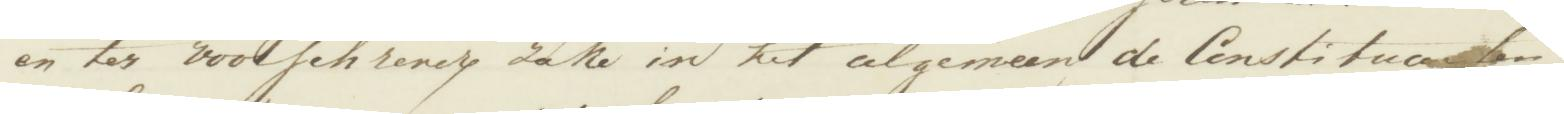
en ter voorschreven zake in het algemeen de Constituanten
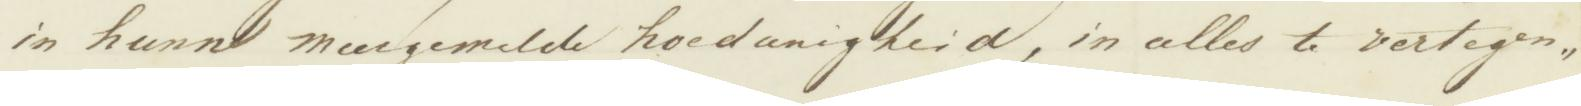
in hunne meergemelde hoedanigheid, in alles te vertegen„
